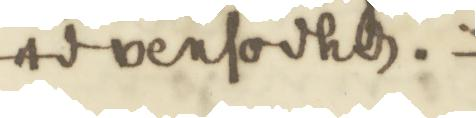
te versoeken.
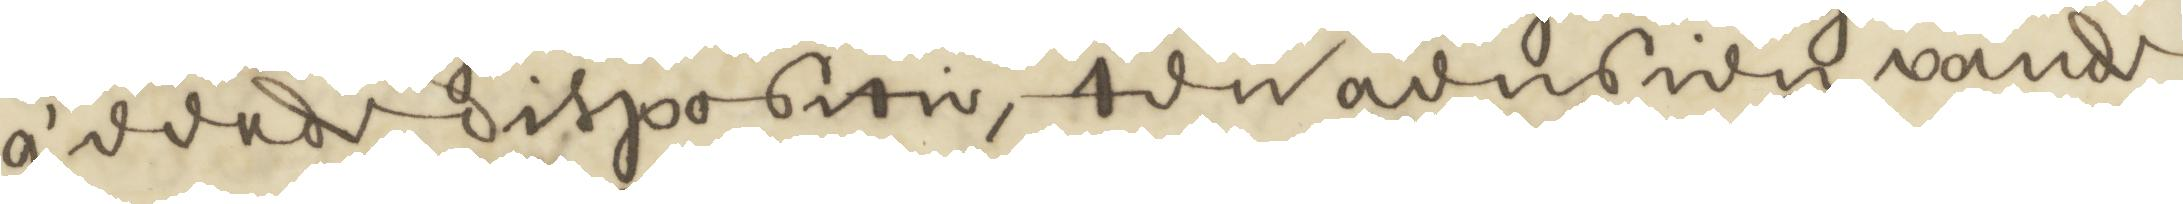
g’eerde dispositie, ten aensien vande
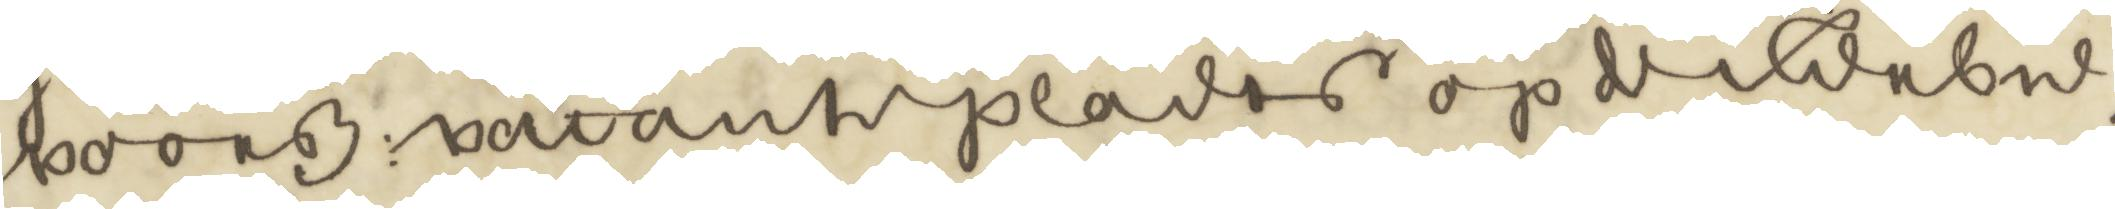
voors: vacante plaets op de Eerbie
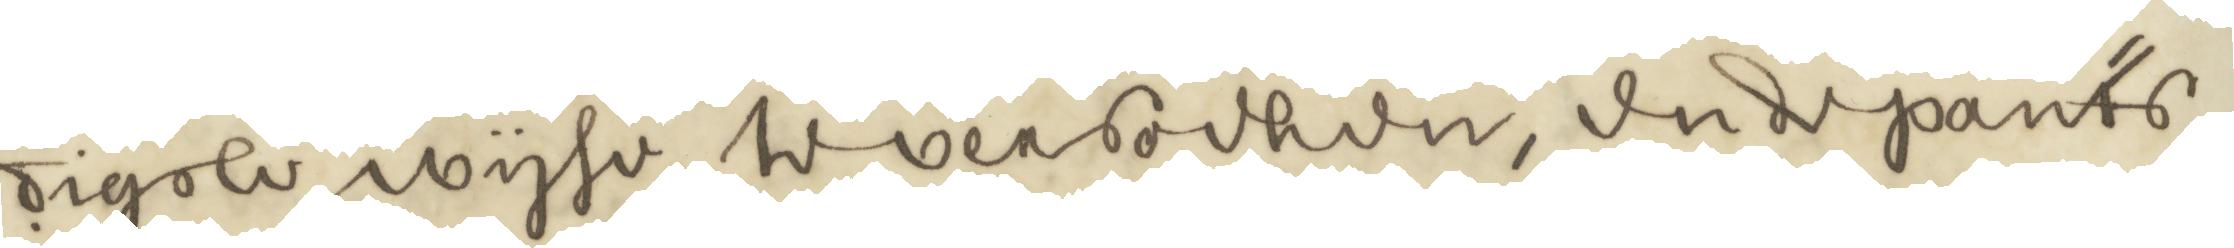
digste wijse te versoeken, en de pants
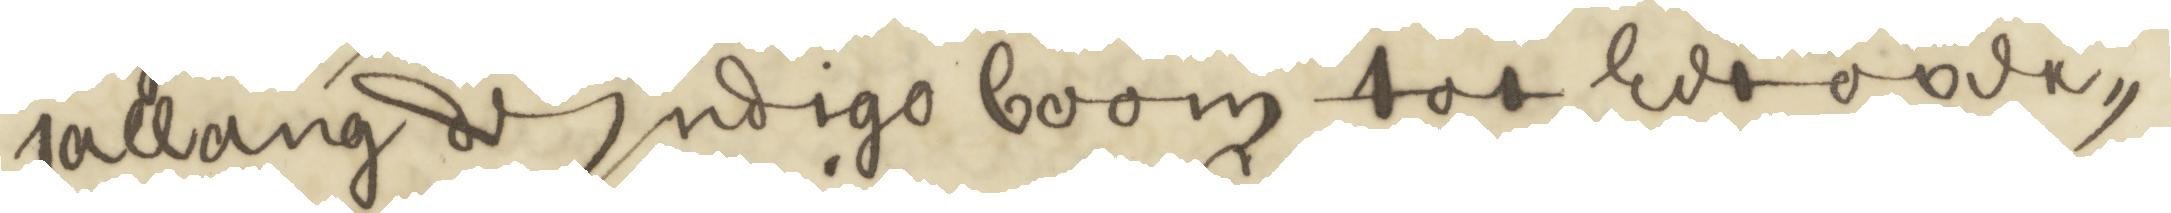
jallang de Indigo boom tot het over„
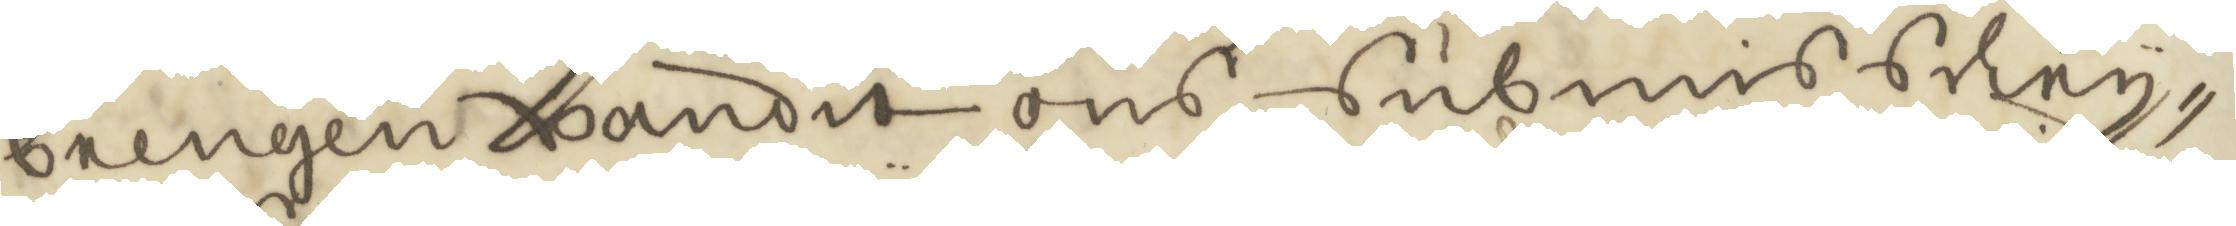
brengen van dit ons submis schrij„
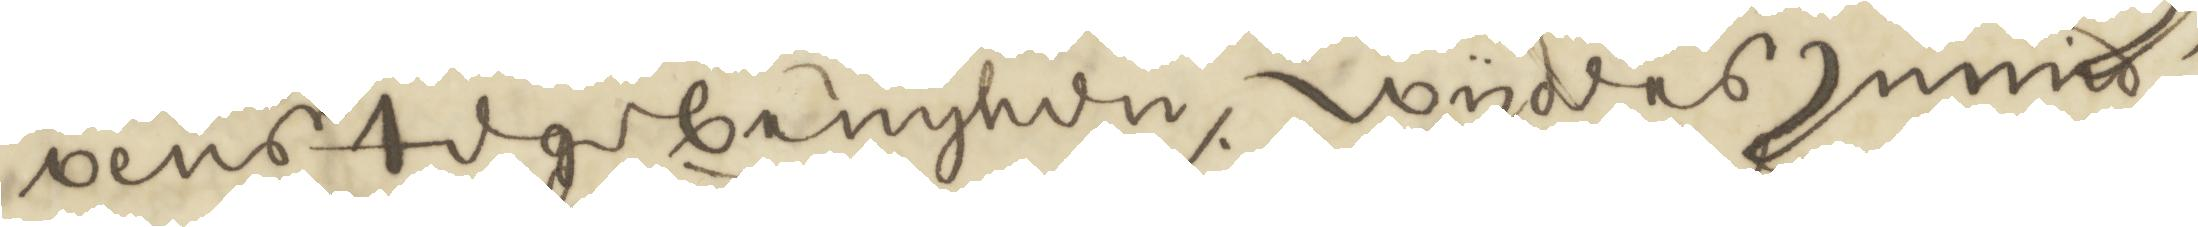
vens te gebruijken, wijders Inmid
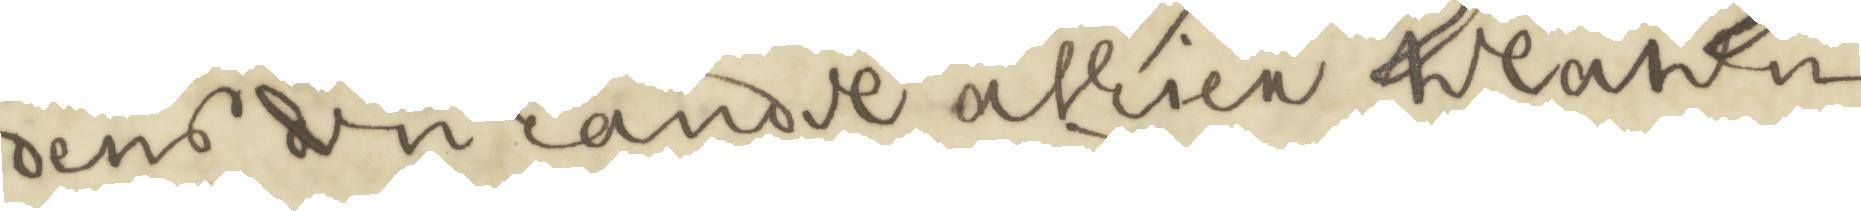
dens den handel alhier telaten
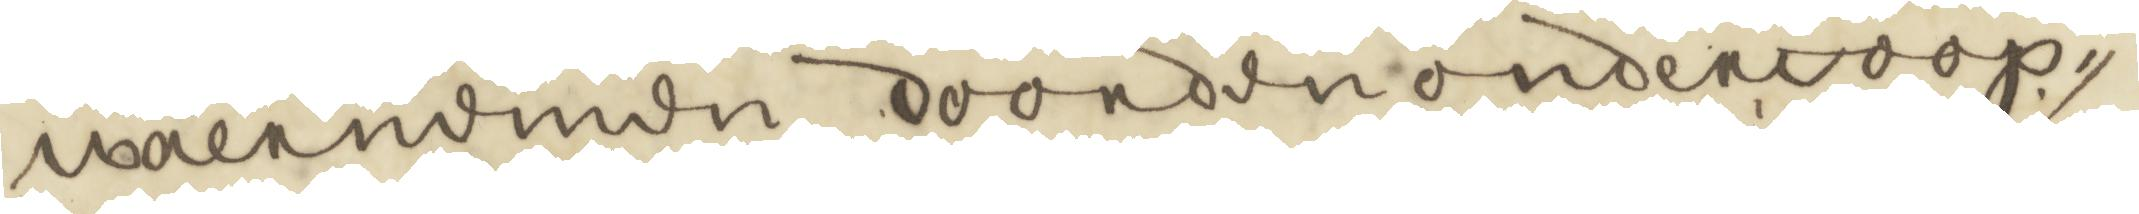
waernemen door den ondercoop„
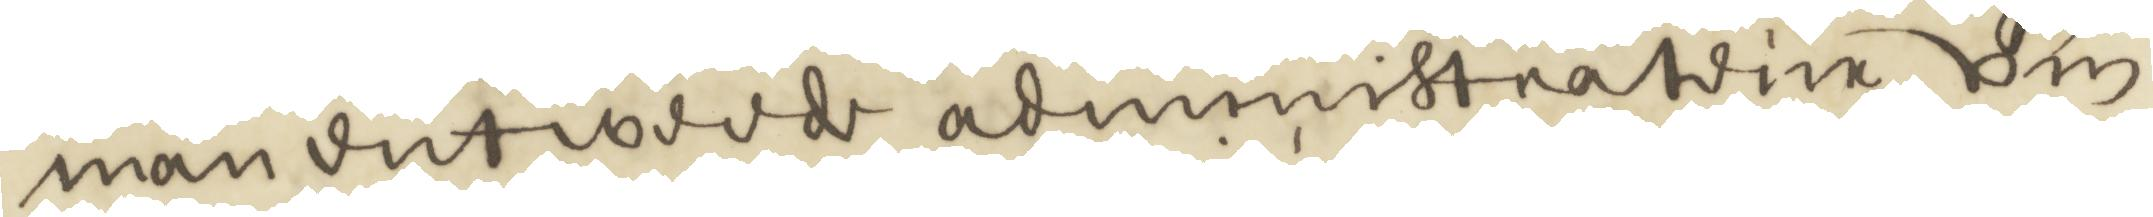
man entweede administrateur vin
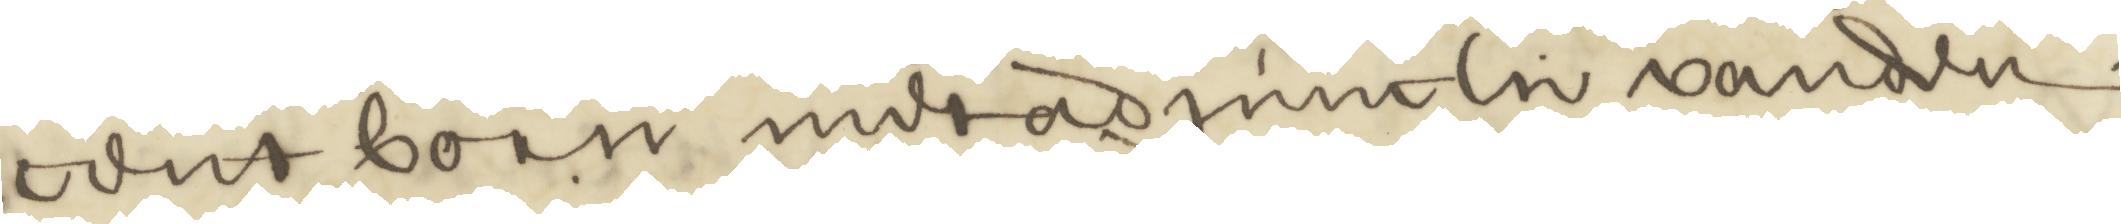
cent born met adjunctie vanden
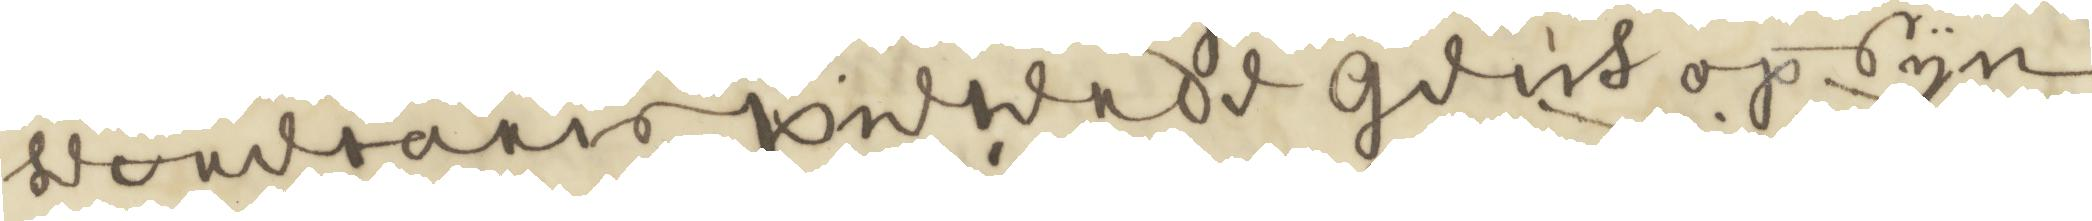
secretaris pieter de geus op sijn
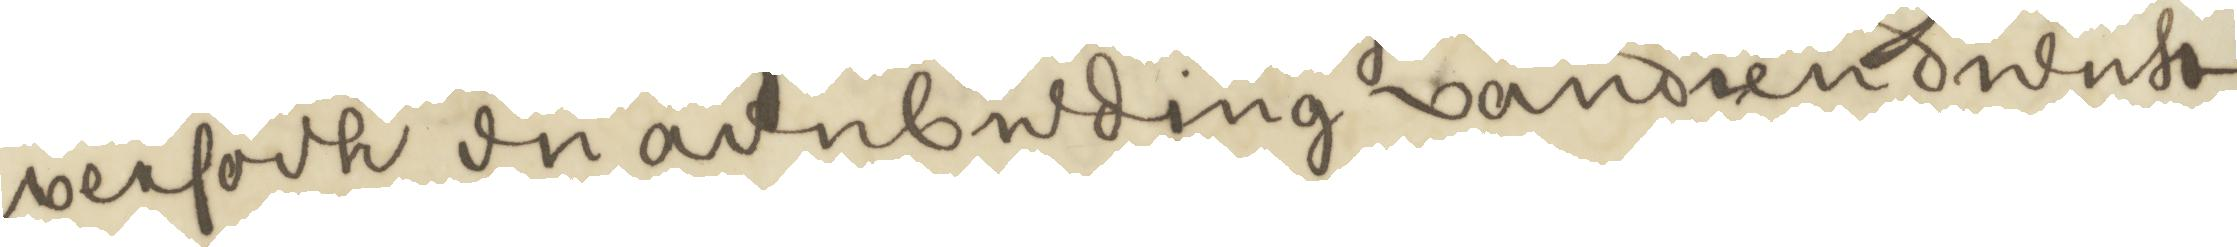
versoek en aenbieding vandien dienst
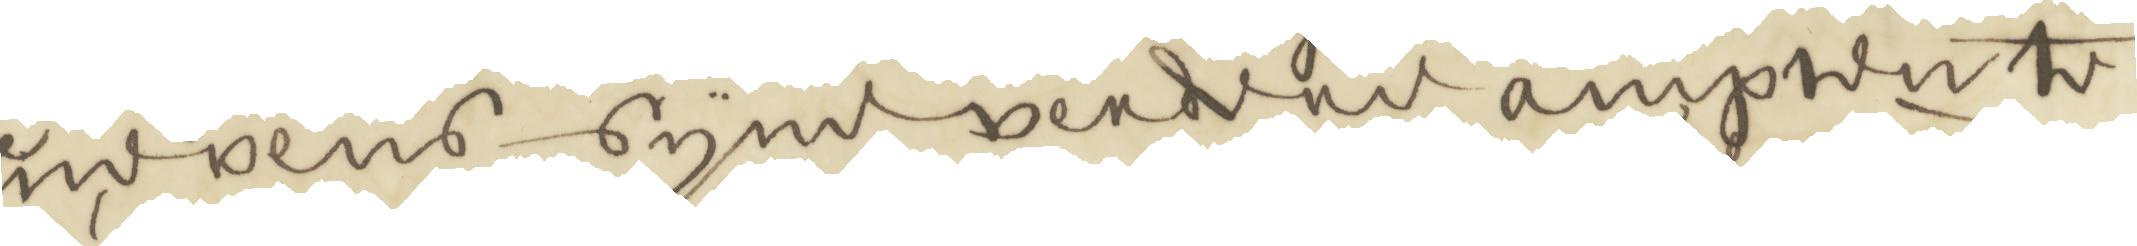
nevens sijne verdere ampten te
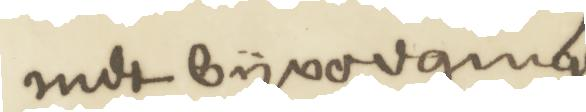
met bijvoeginge
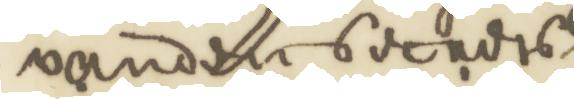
vanden secrets
